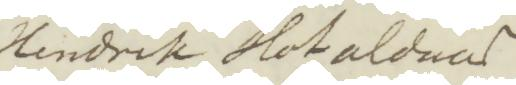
Hendrik slot aldaar
